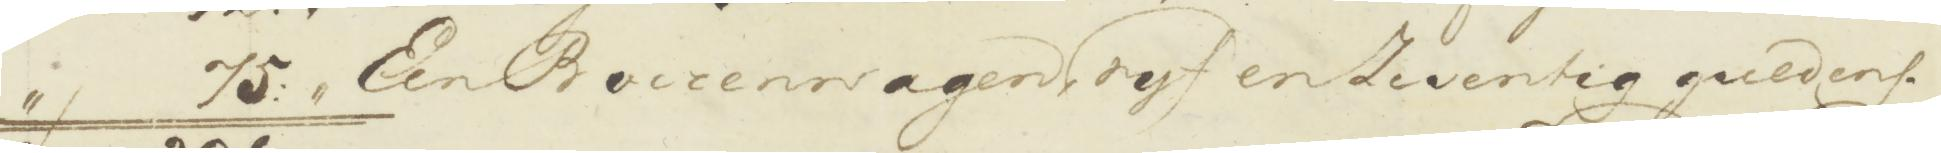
„ 75: „ Een Boerenwagen, vyf en zeventig guldens.
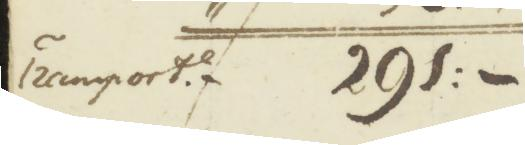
Transport.e ƒ 291: —
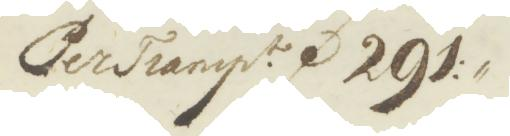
Per Transp:t ƒ 291: „
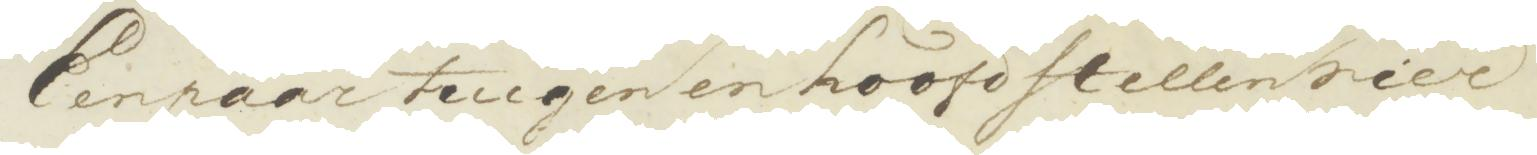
Een paar tuigen en hoofdstellen vier
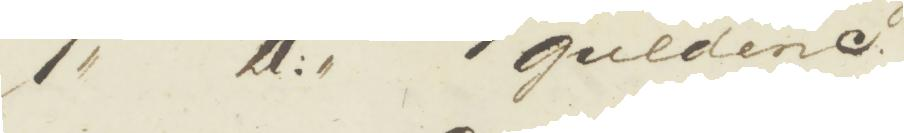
„ 4: „ guldens.
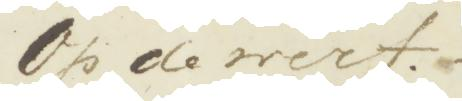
Op de werf.
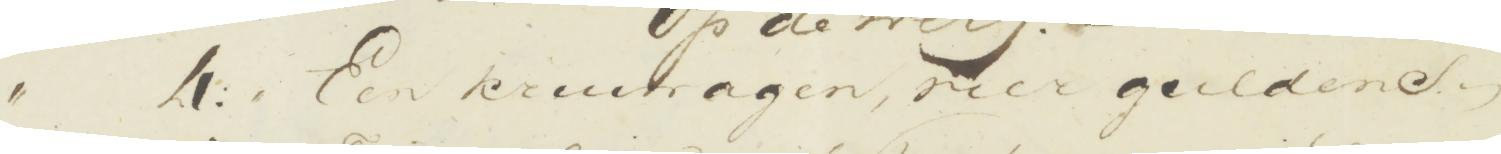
„ 4: „ Een kruiwagen, vier guldens. —
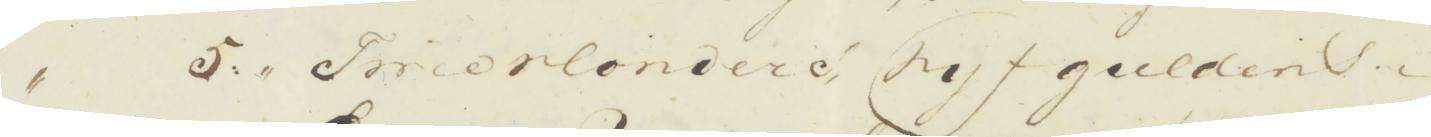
„ 5: „ Twee vlonders, vyf guldens. —
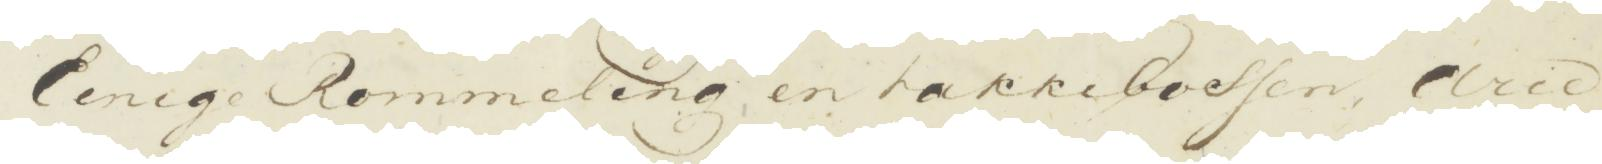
Eenige Rommeling en takkebossen, drie
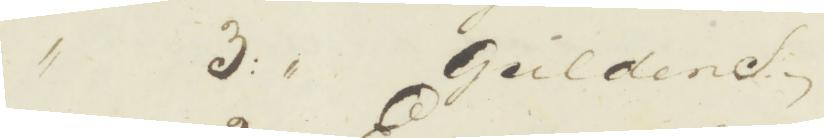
„ 3: „ Guldens. —
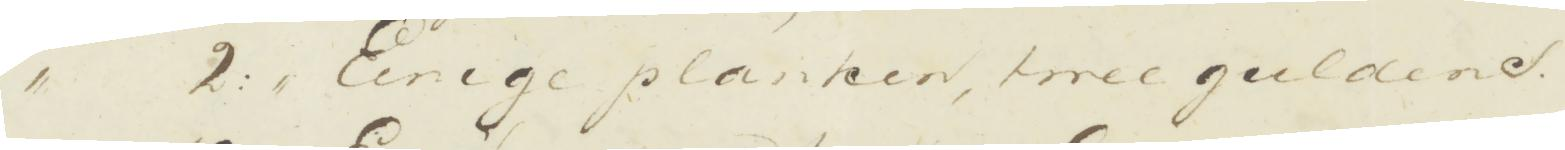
„ 2: „ Eenige planken, twee guldens.
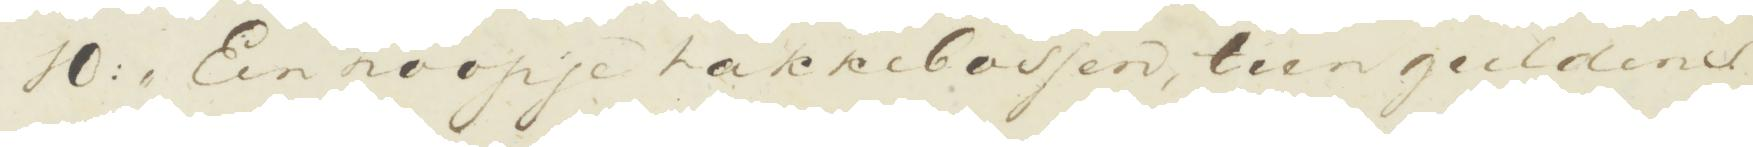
10: „ Een hoopje takkebossen, tien guldens.
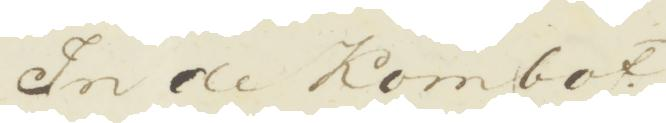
In de Kombof.
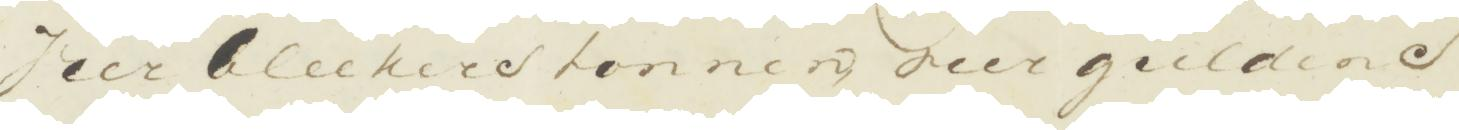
Vier bleekerstonnen, vier guldens
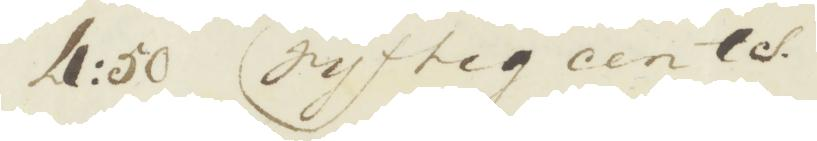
4: 50 vyftig cents.
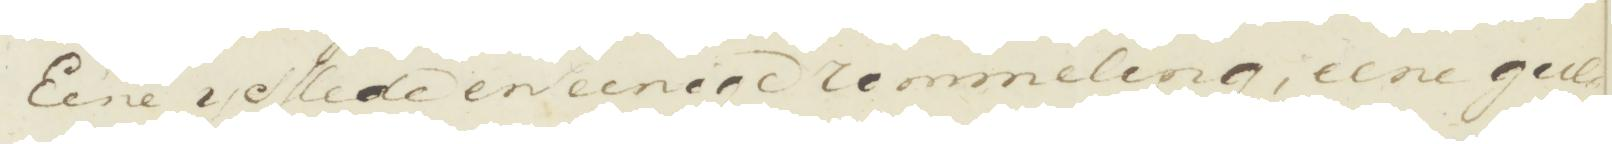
Eene ysflede en eenige rommeling, eene gul„
